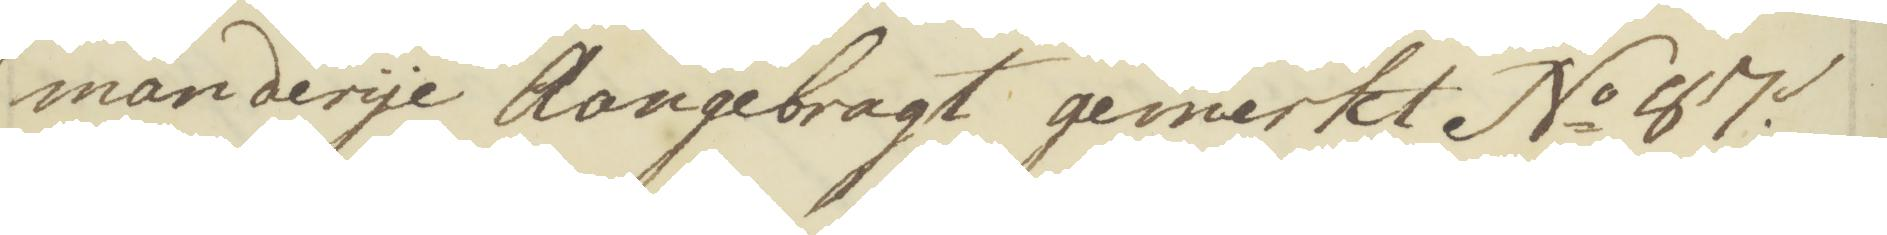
manderije Aangebragt gemerkt N=o 87.s
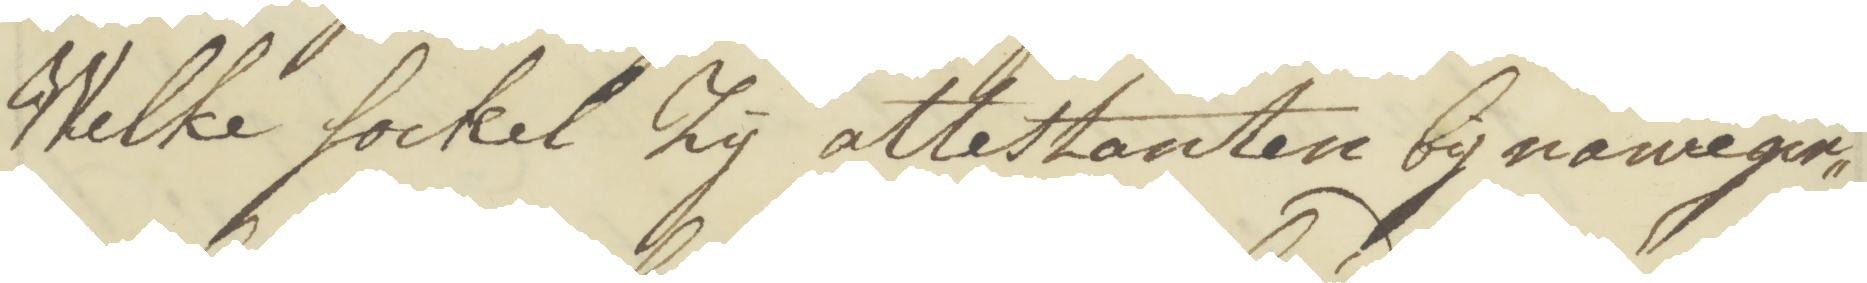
Welke sockel zij attestanten bij nawegin„
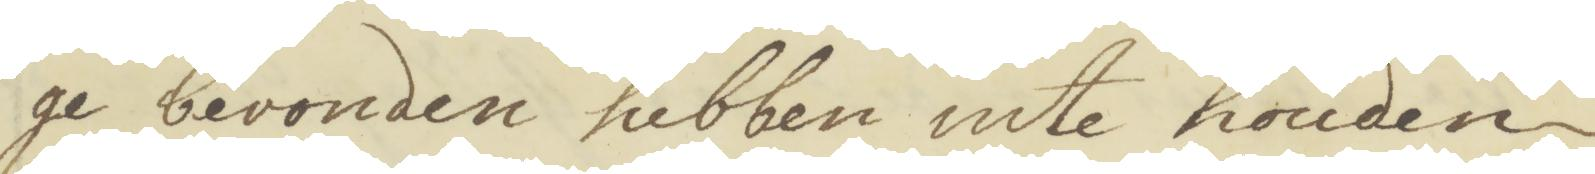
ge bevonden hebben in te houden
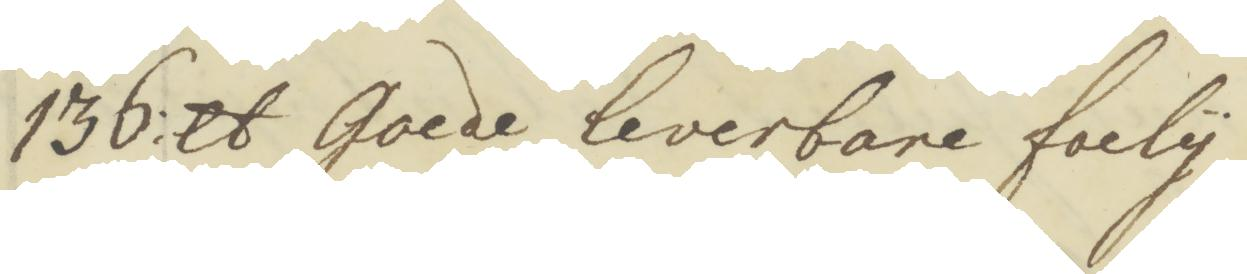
136: lb goede leverbare foelij
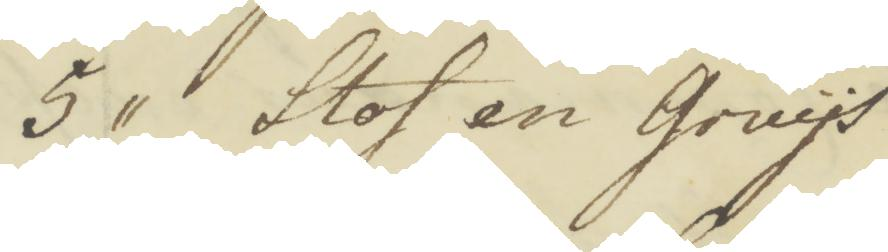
5 „ stof en Gruijs
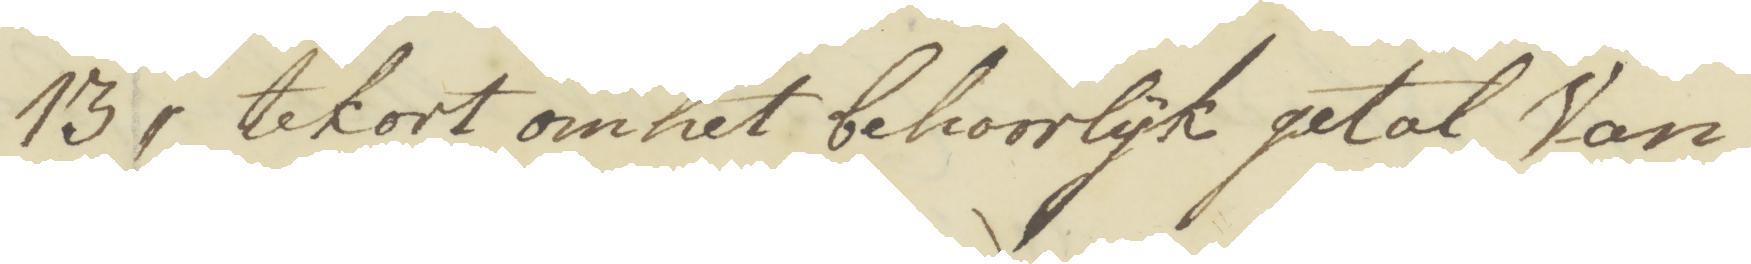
13 „ tekort om het behoorlijk getal van
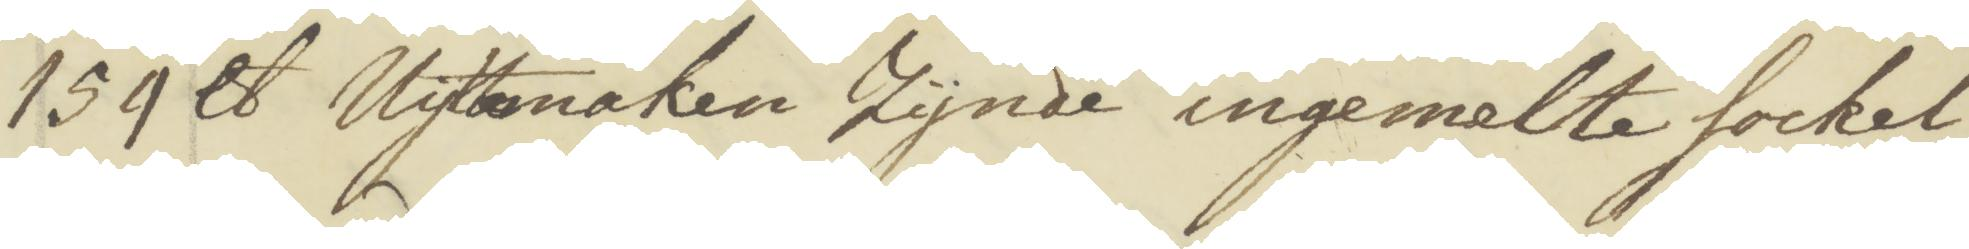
154 lb Uijtemaken zijnde ingemelte sockel
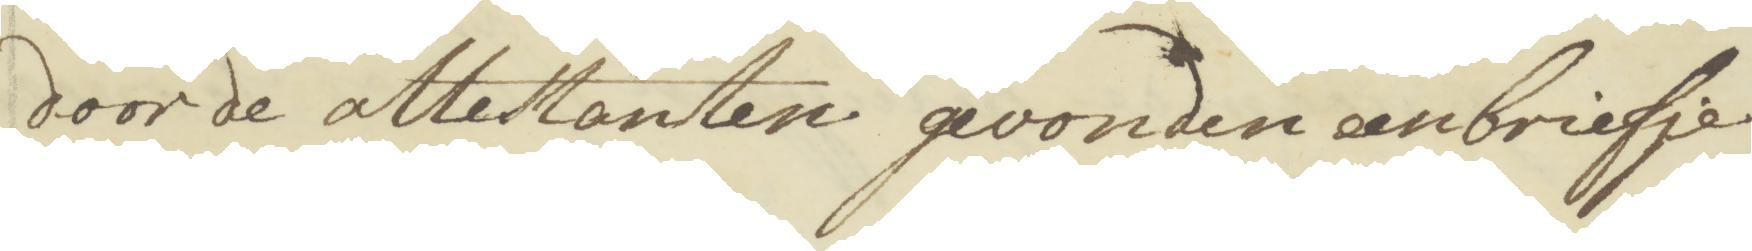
door de attestanten gevonden een briefje
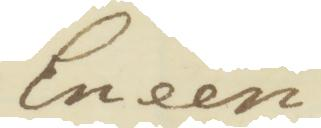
En een
